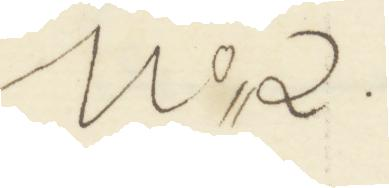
No„ 2.
